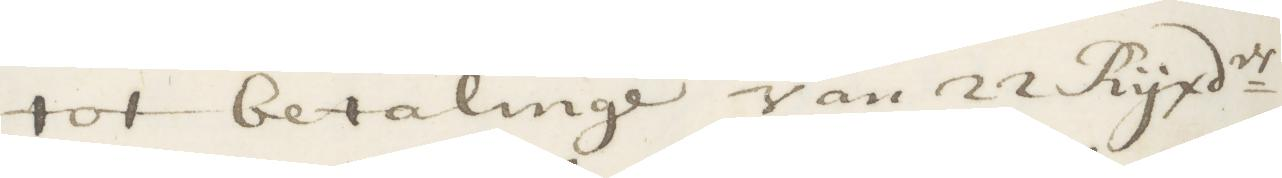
tot betalinge van 22 Rijxd=r
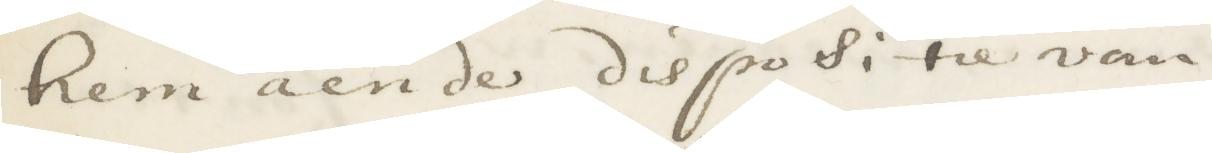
hem aen de dispositie van
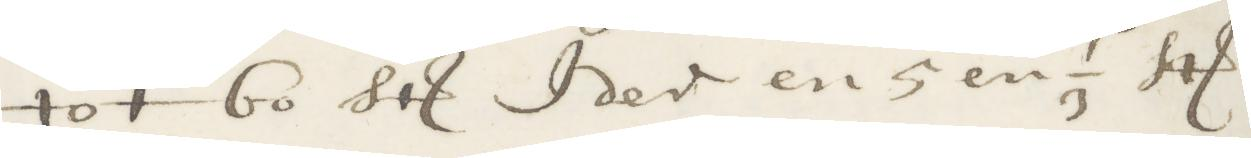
tot 60 stver Ider en 5 en 1/3 stver
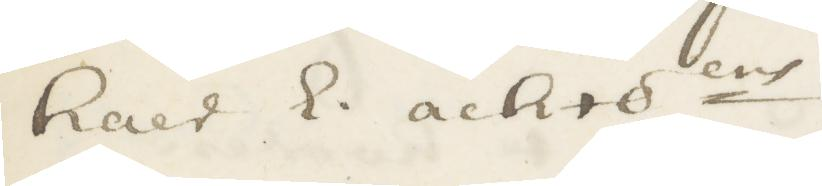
haer E. achtb=le
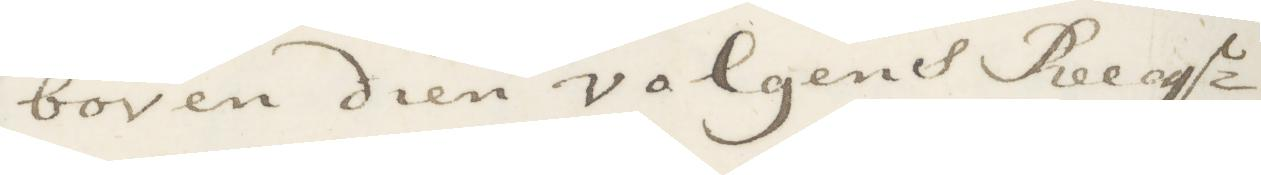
boven dien volgens Reec=t
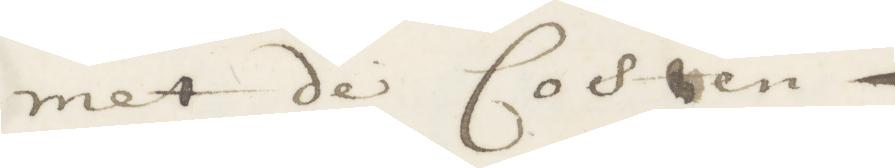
met de Costen-
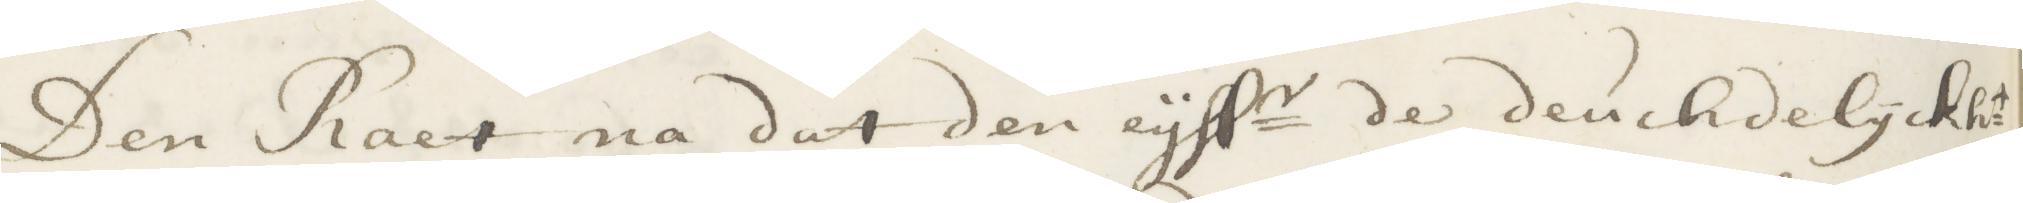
Den Raet na dat den eijss=r de deuchdelijckh=t
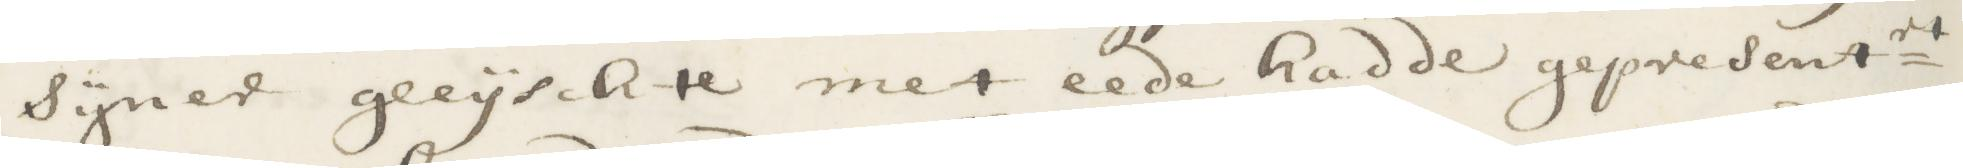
sijner geeijschte met eede hadde gepresent=rt
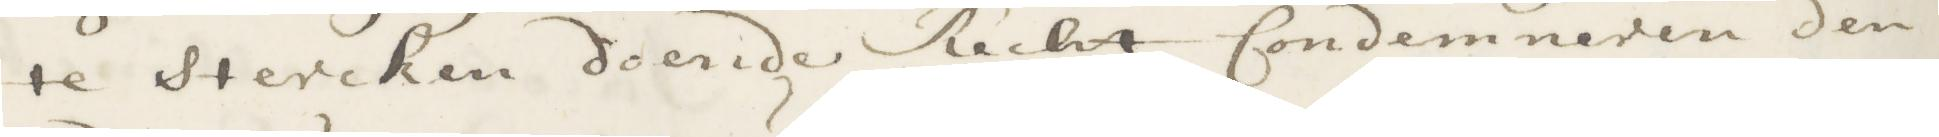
te stercken doende Recht Condemneren den
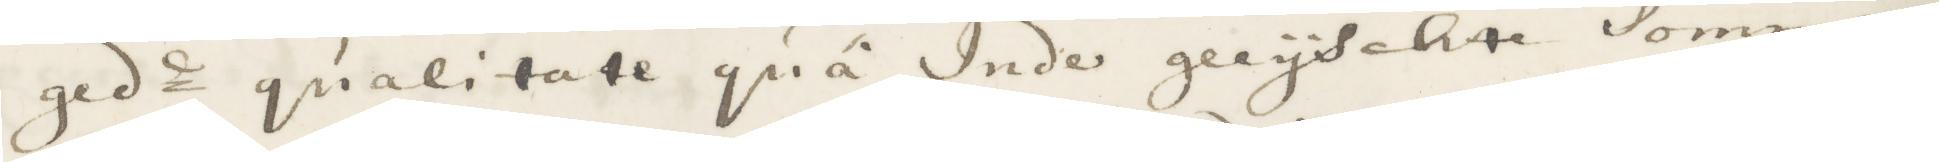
ged=te qualitate qua Inde geeijschte somme
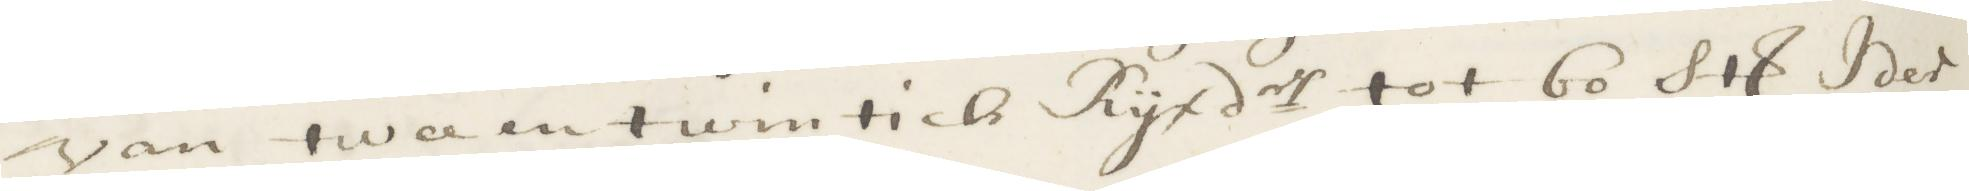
van twee en twintich Rijxd=r tot 60 stver Ider
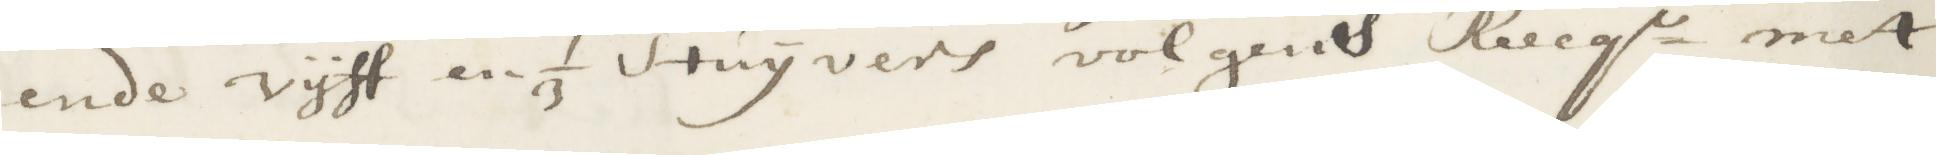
ende vijff en 1/3 stuijvers volgens Reecq=e met
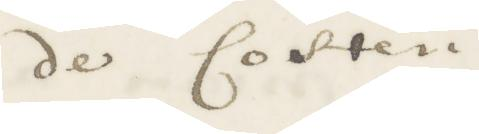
de Costen
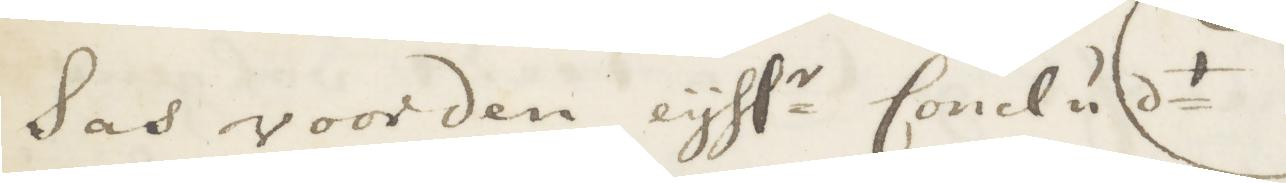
sas voor den eijss=r Conclud=t
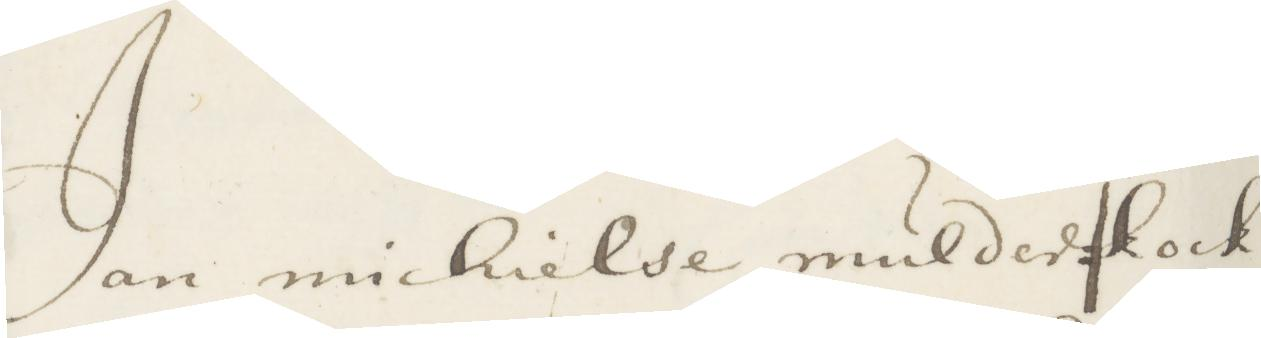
Ian michielse mulder | kock
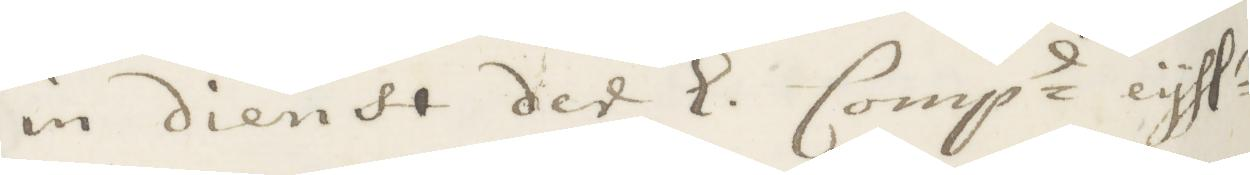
in dienst der E. Comp=e eijss=r
